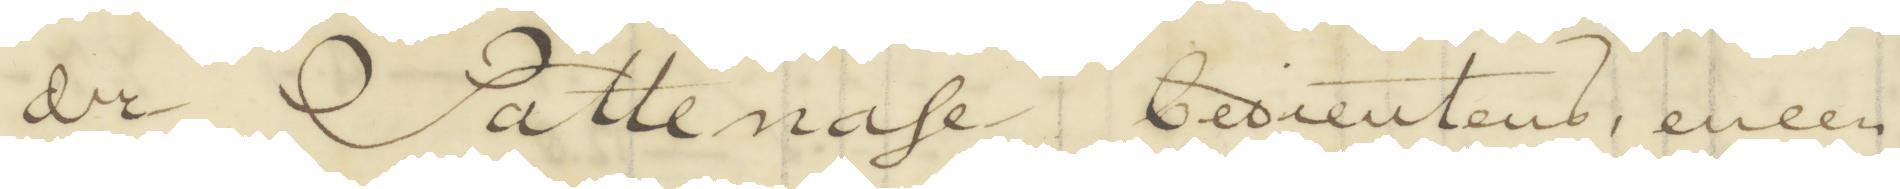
der Pattenase bedientens, en een
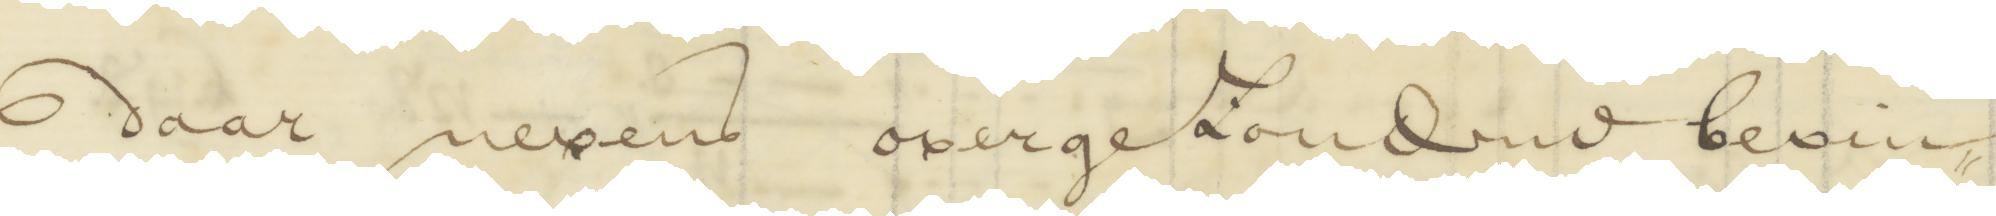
daar nevens overgeZondene bevin„
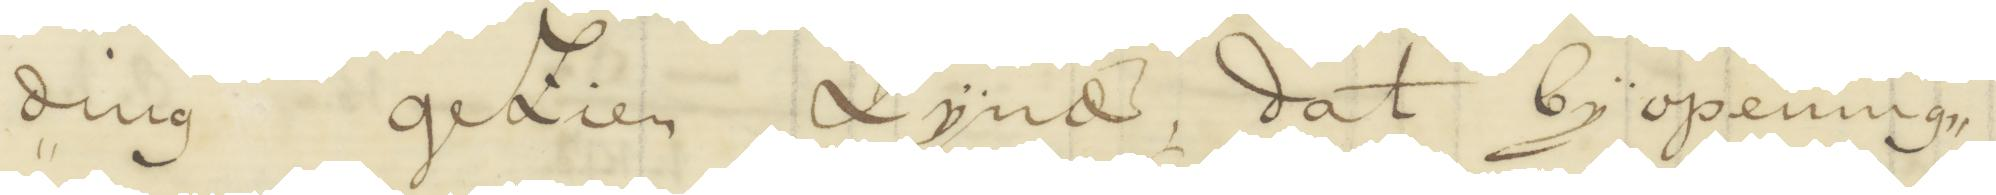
„ding geZien Zijnde, dat bij opening„
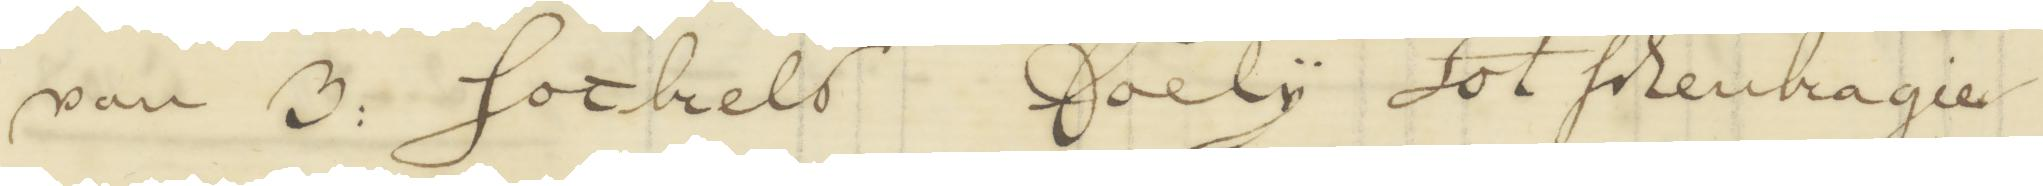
van 3: sockels foelij tot schenkagie
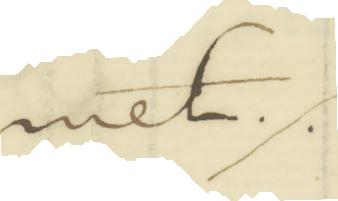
met ./.
